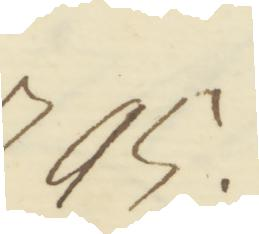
745.
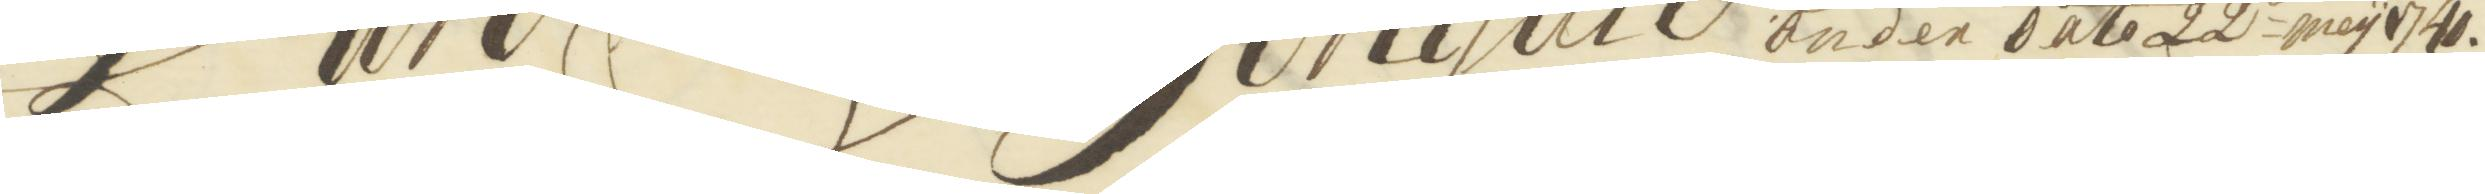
Van Bengale onder dato 22=' meij 1741
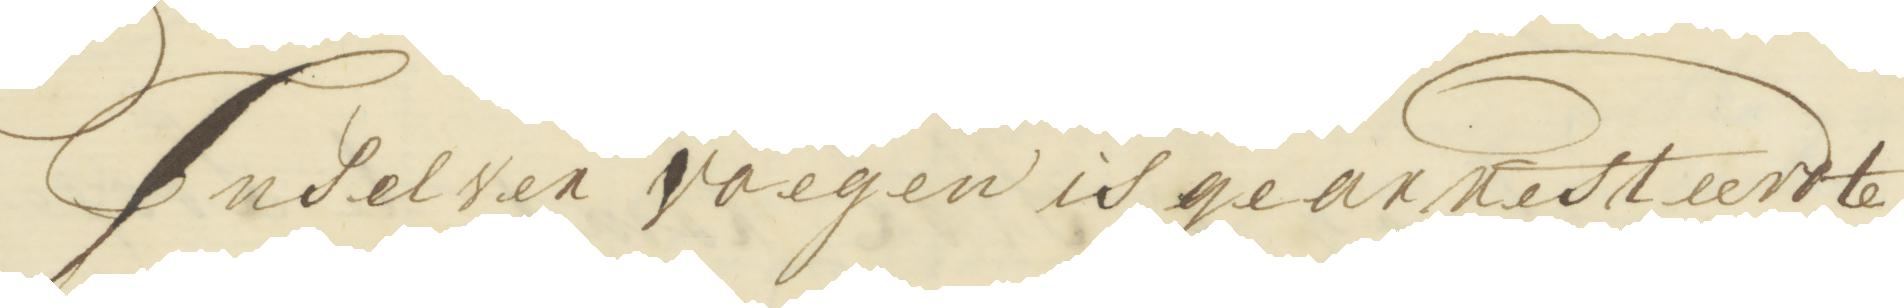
Inselver voegen is gearresteerd te
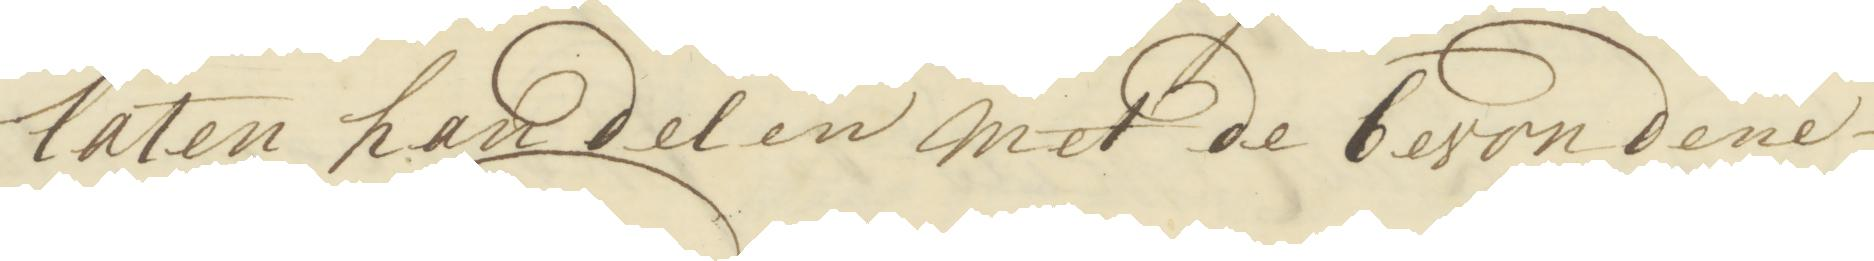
laten handelen met de bevondene
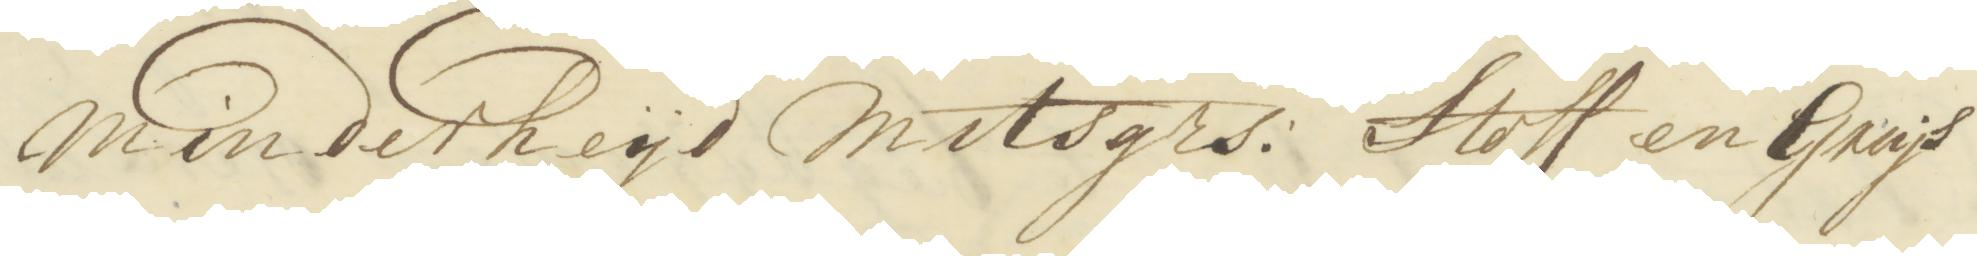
minderheijd mitsgrs: Stoff en Grujs
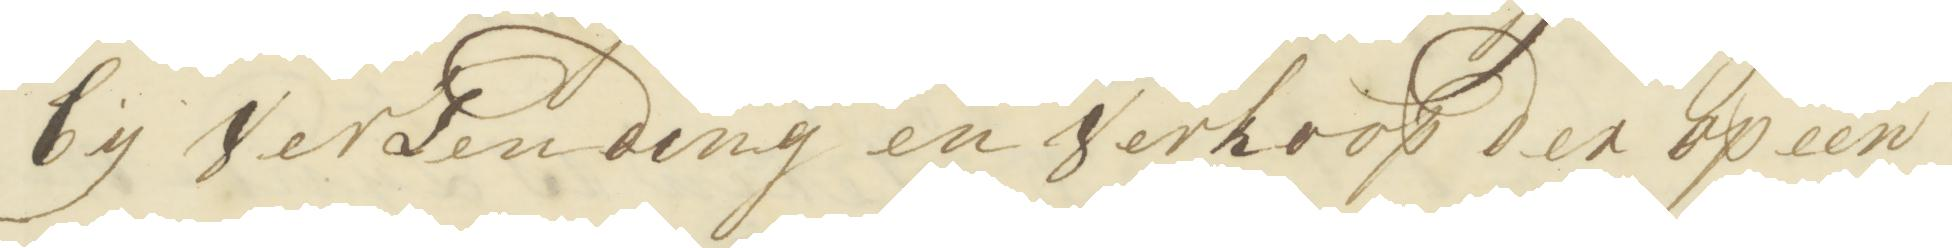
bij verzending en verkoop der op een
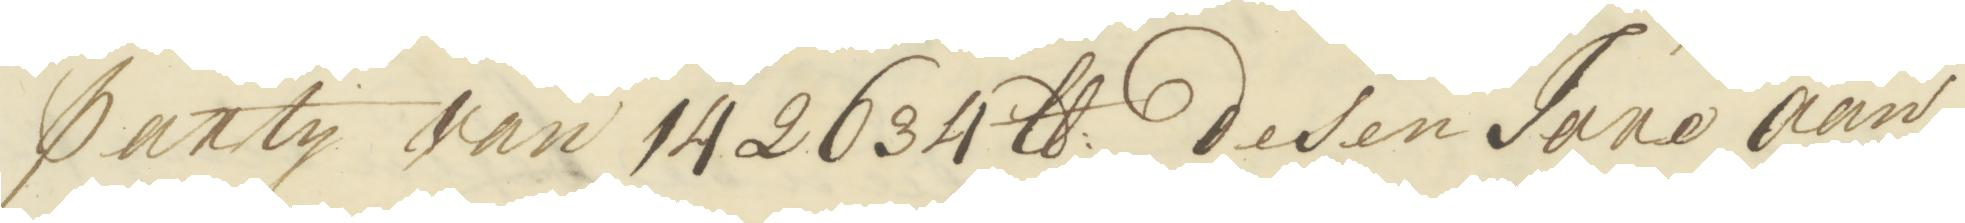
Partij van 142634 lb: desen Iare aan
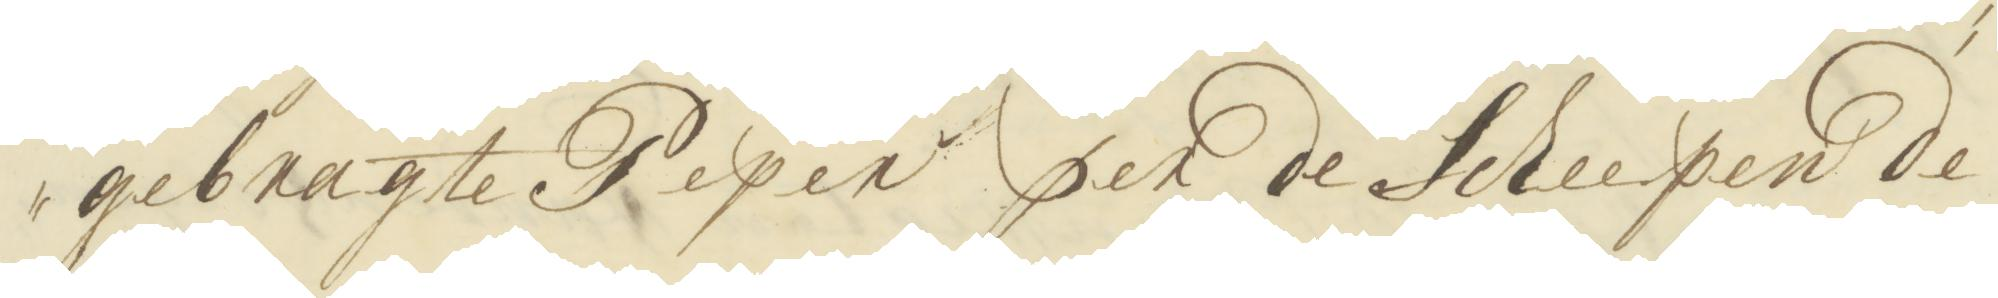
„gebragte Peper per de scheepen de
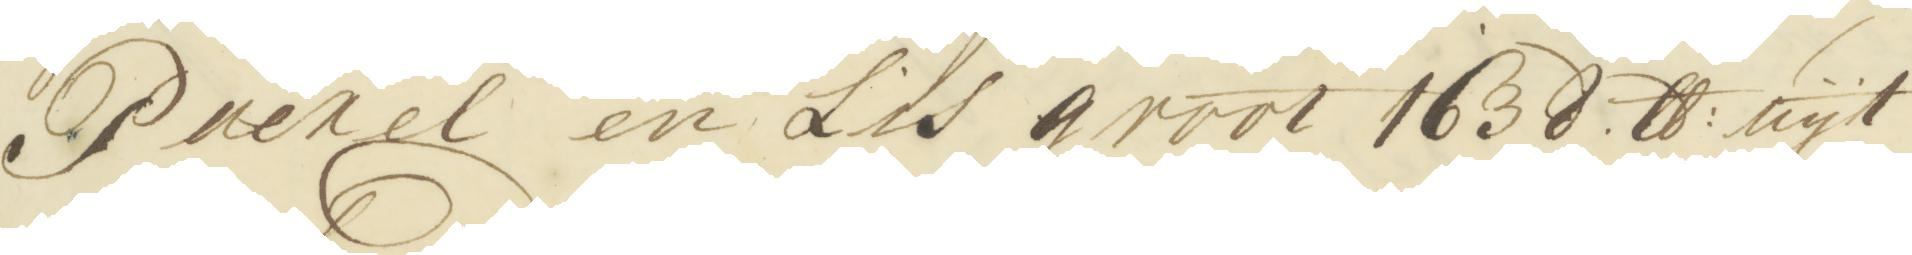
Paerel en Lis groot 1638: lb: uijt
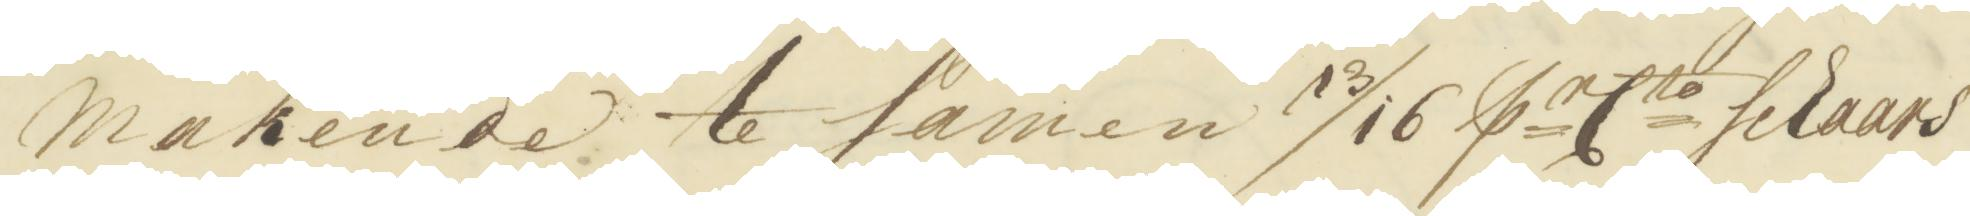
makende te samen 13/16 p=r C=to schaars
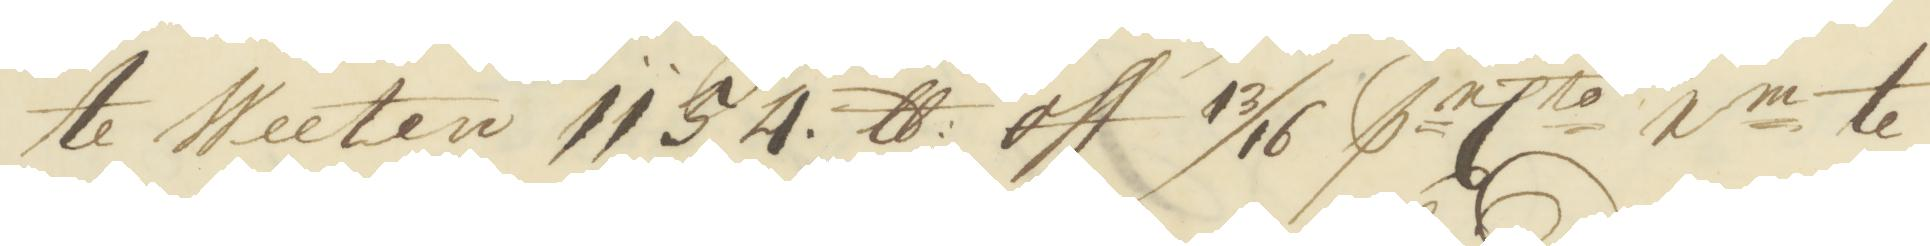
te weeten 1154. lb: off 13/16 p=r C=to r=m te
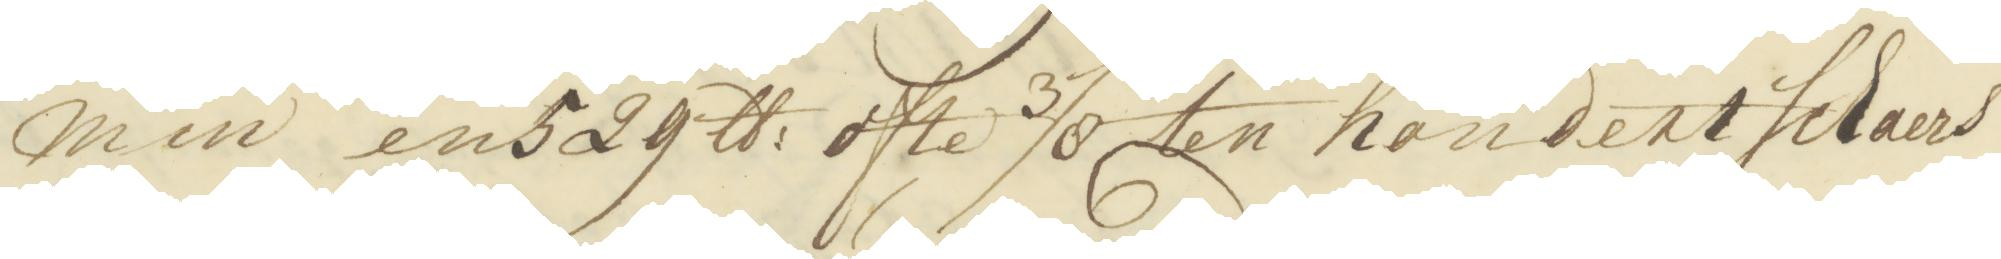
min en 529 lb: ofte 3/8 ten hondert schaers
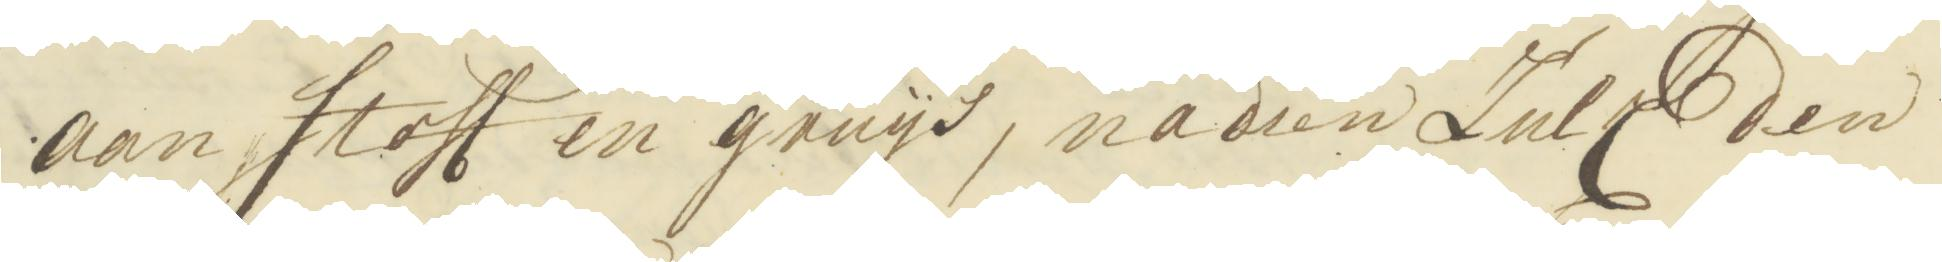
aan Stoff en gruijs, nadien zulx den
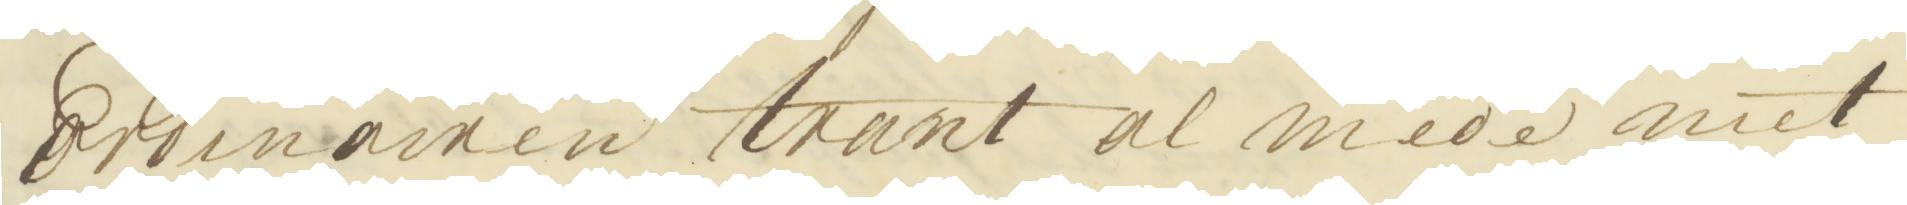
ordinairen trant al mede niet
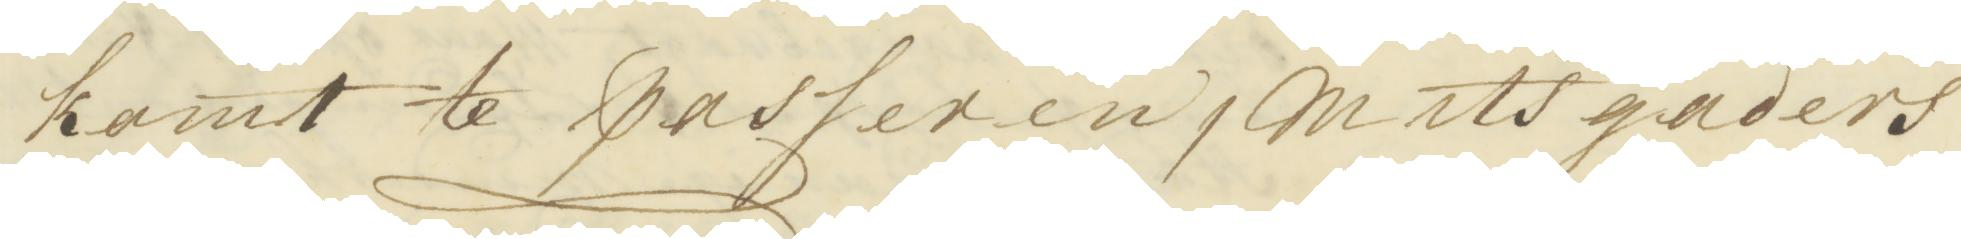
komt te passeren, mitsgaders
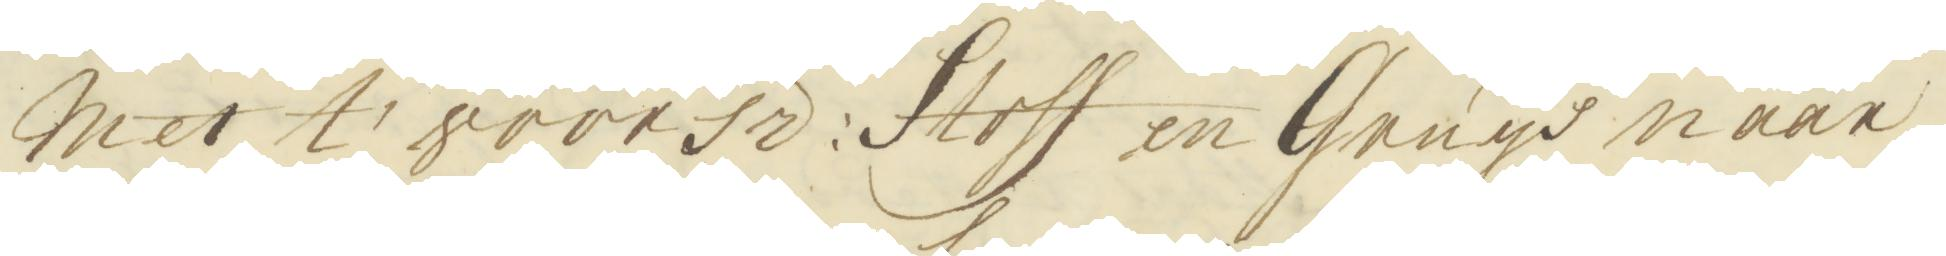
met t' voorsz: Stoff en Gruijs naar
